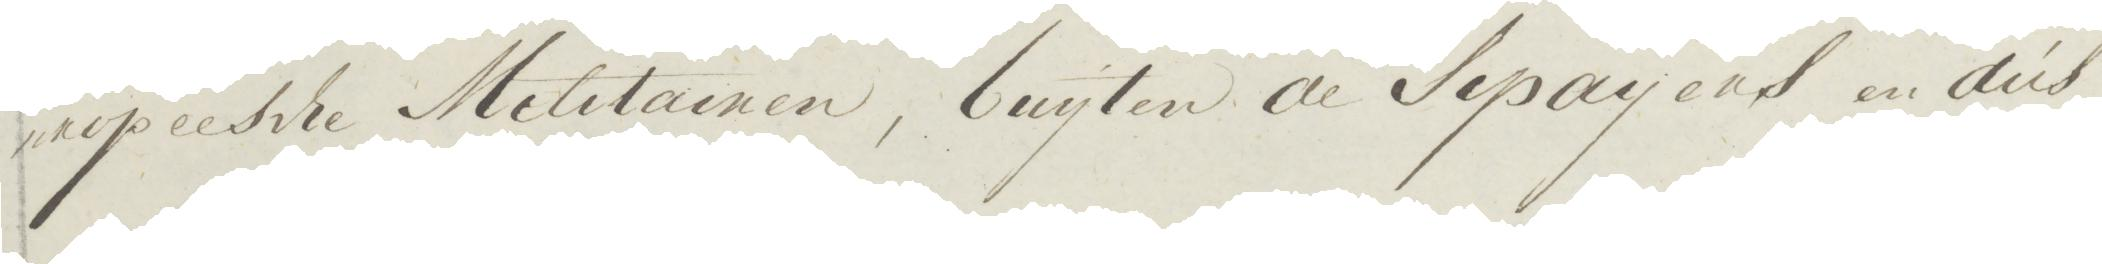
ropeesche Militairen, buijten de sepaijers en dus
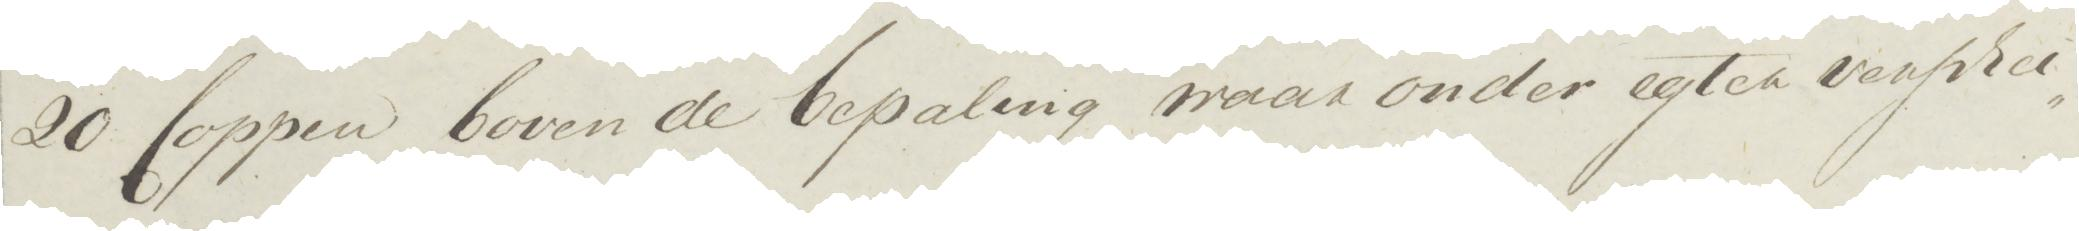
20 Coppen boven de bepaling waar onder egter verschei„
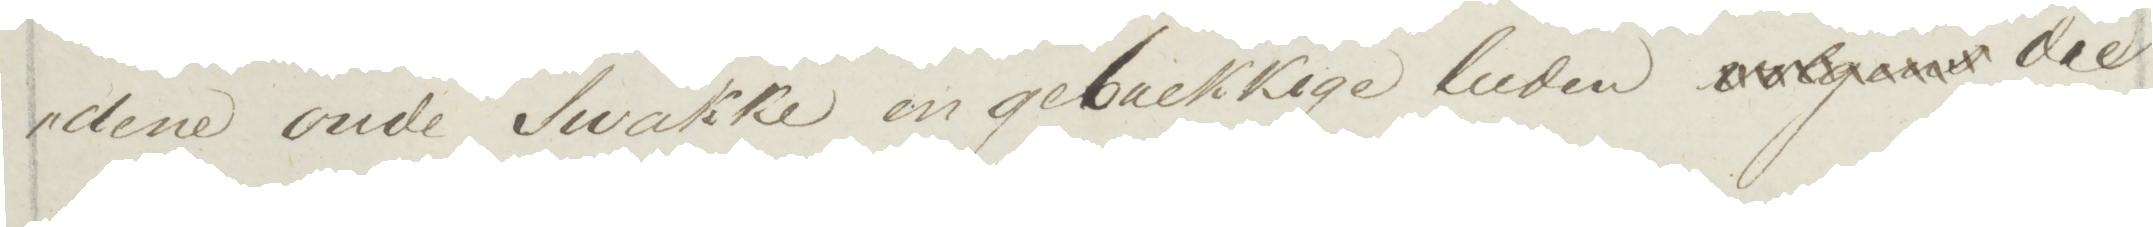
dene oude swakke en gebrekkige lieden volgens die
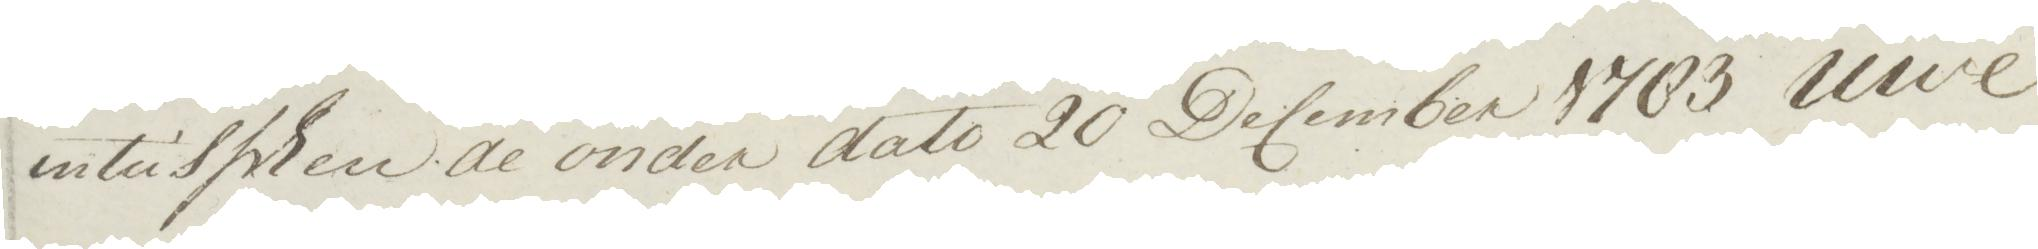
intusschen de onder dato 20 December 1783 uwe
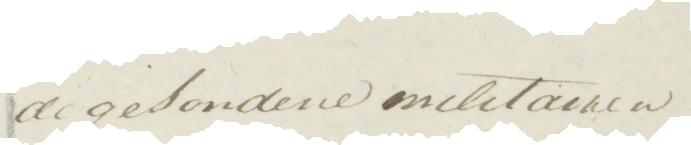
de gesondene militairen
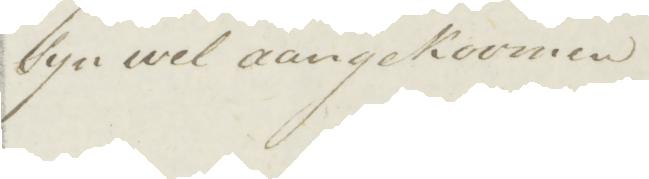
syn wel aangekoomen
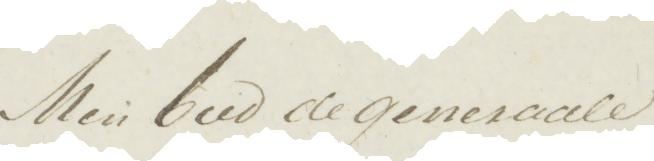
Men bied de generaale
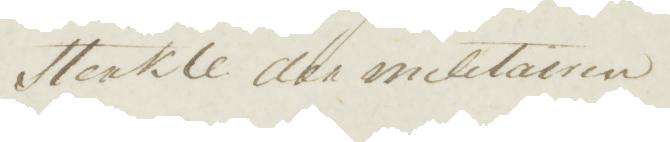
sterkte der militairen
